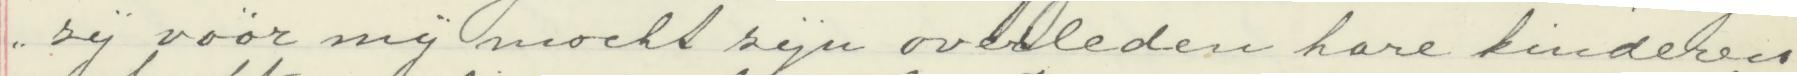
„ zij vóór mij mocht zijn overleden hare kinderen
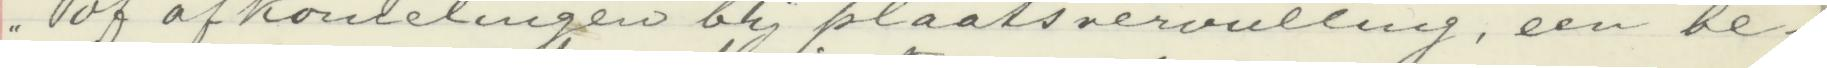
„ of afkomelingen bij plaatsvervulling, een be-
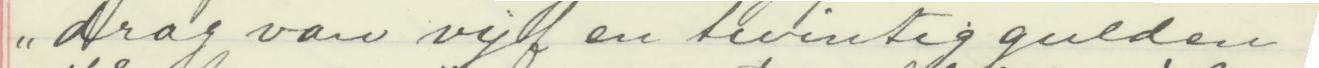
„ drag van vijf en twintig gulden
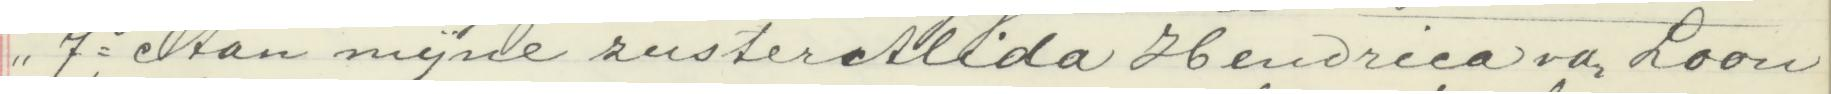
„ 7=o Aan mijne zuster Alida Hendrica van Loon
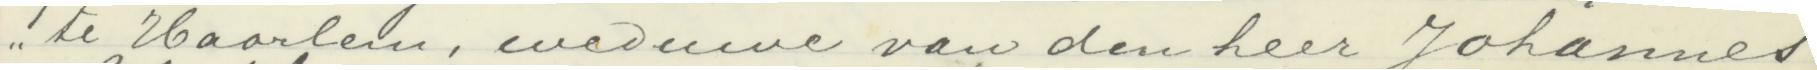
„ te Haarlem, weduwe van den heer Johannes
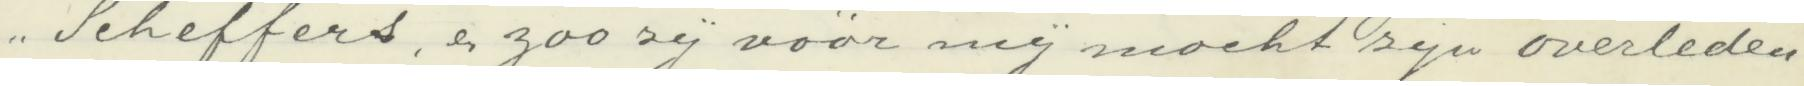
„ Scheffers, en zoo zij vóór mij mocht zijn overleden
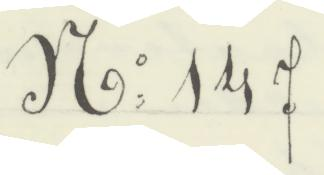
N=o 147
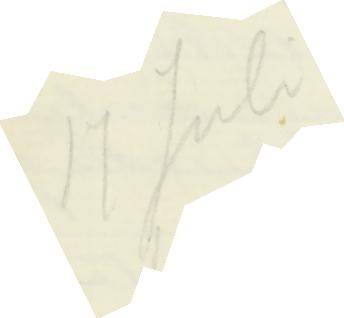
17 Juli
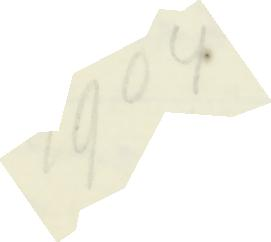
1904
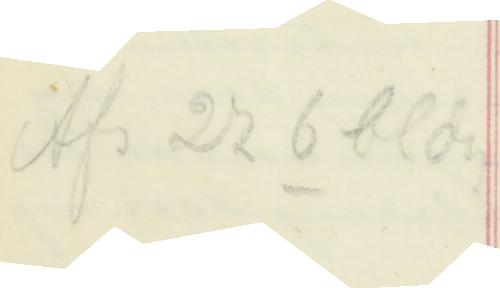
Afs 27 6 bldn
